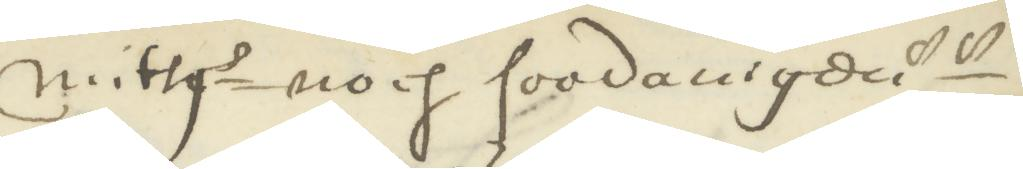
mitsg=s noch soodanigen 88
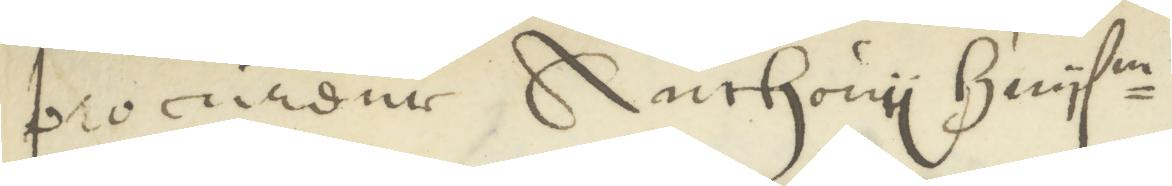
procureur Anthonij huijs=m
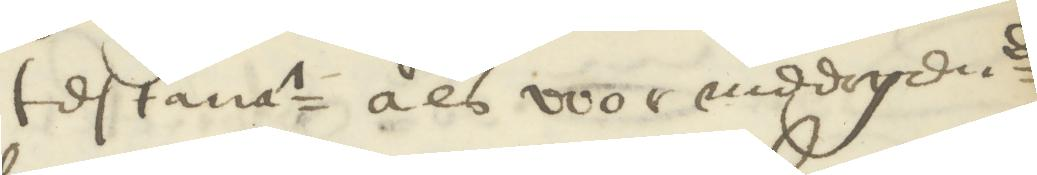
testam=t als voor meergen=
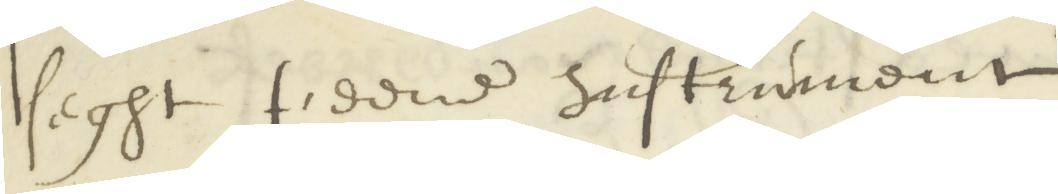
seght t eene Jnstrument
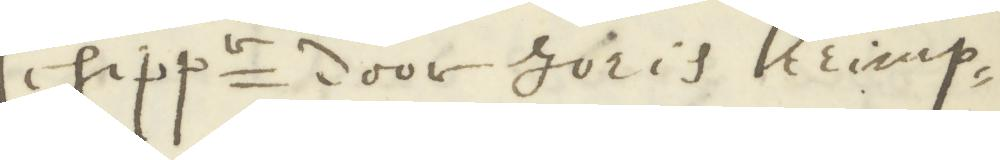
schipp=r door Joris krimp„
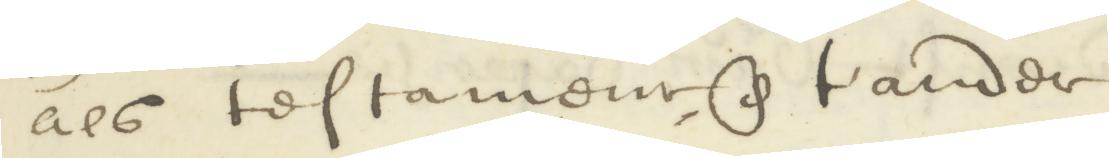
als testament ende t' ander
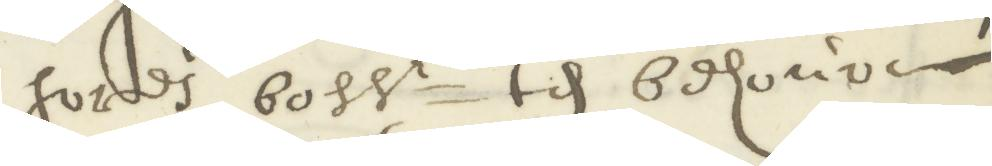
jores boss=r ten behouve
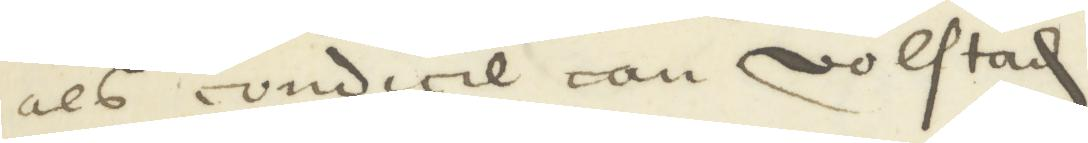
als condicie can volstaen
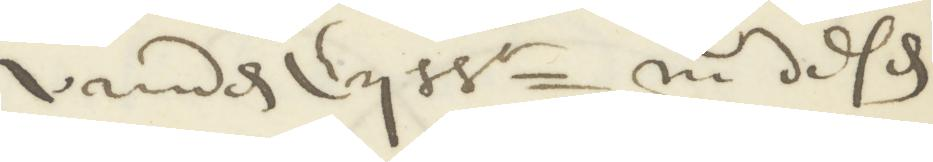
vanden Eyss=r in desen
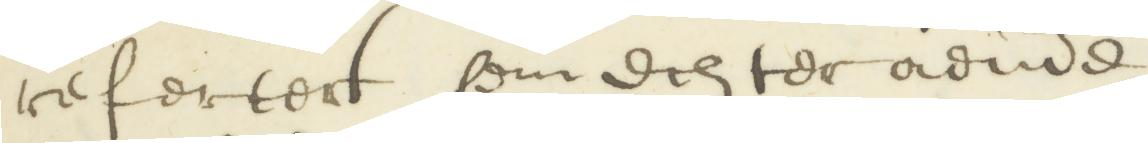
resertert hem echter aende
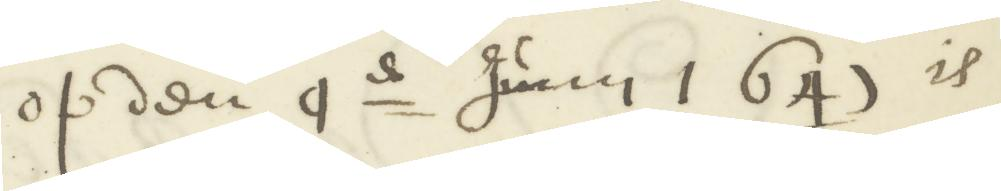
op den 4=e Juny 1641 is
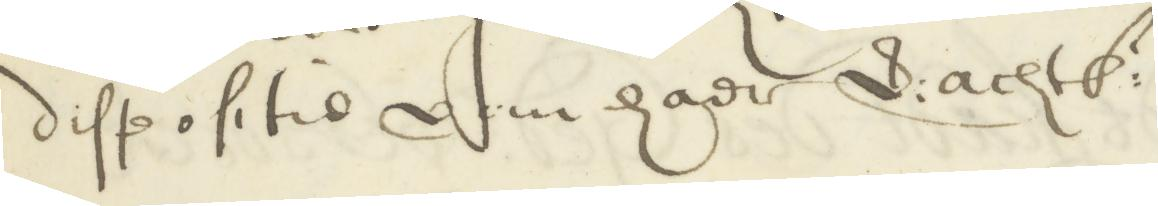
dispositie van haer E: achtb:
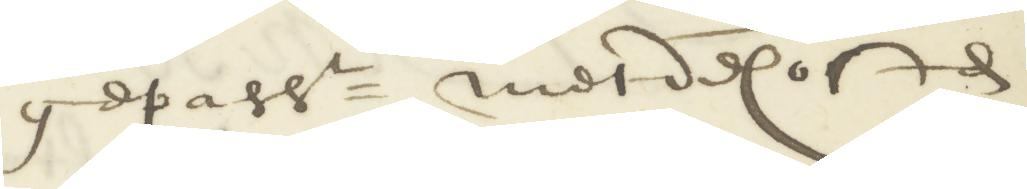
gepass=t met de Costen
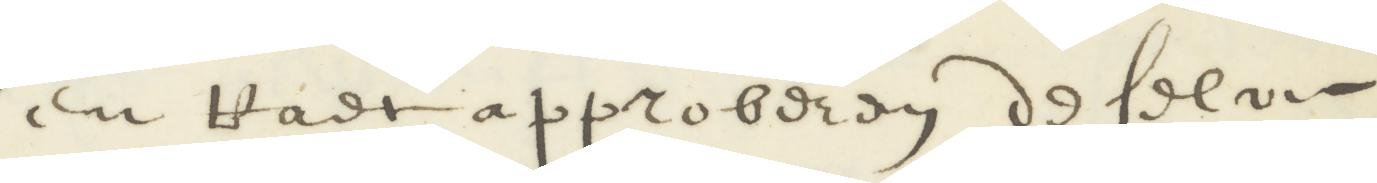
Den Raet approberen de selve
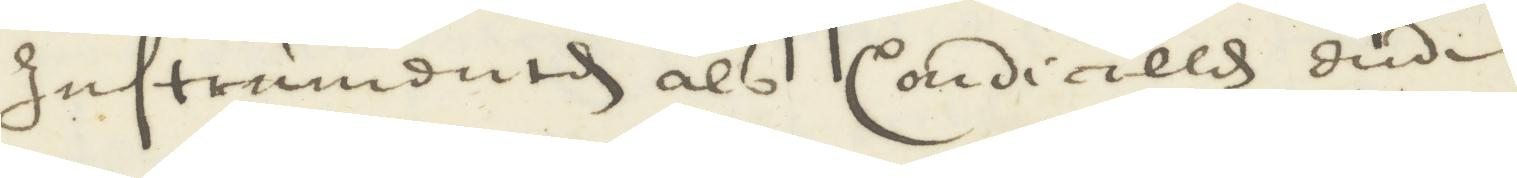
Jnstrumenten als Condicillen ende
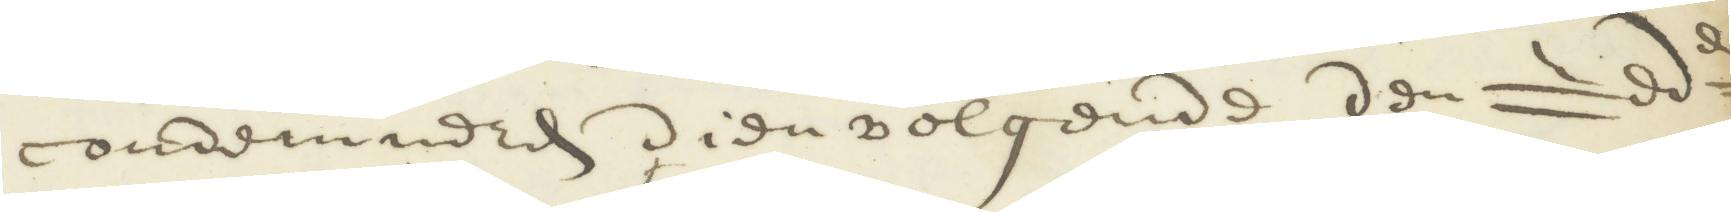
condemneren dien volgende den Eed=e
